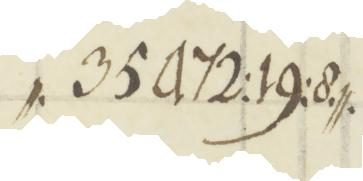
„ 35472:19:8.„
